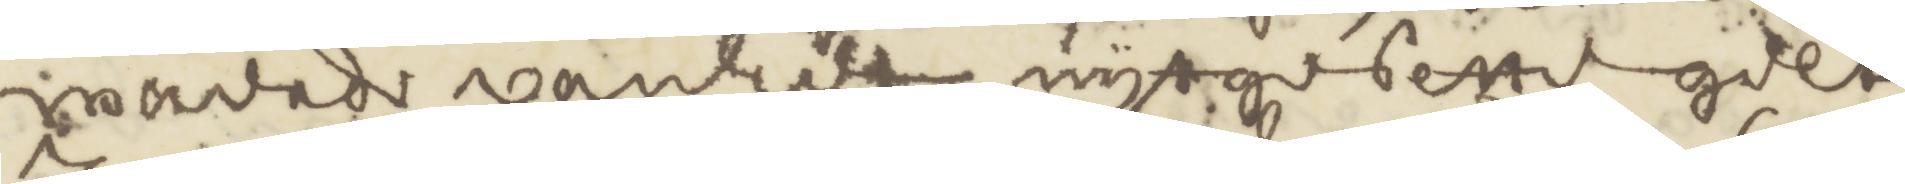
waerde van het uijtgesette gelt
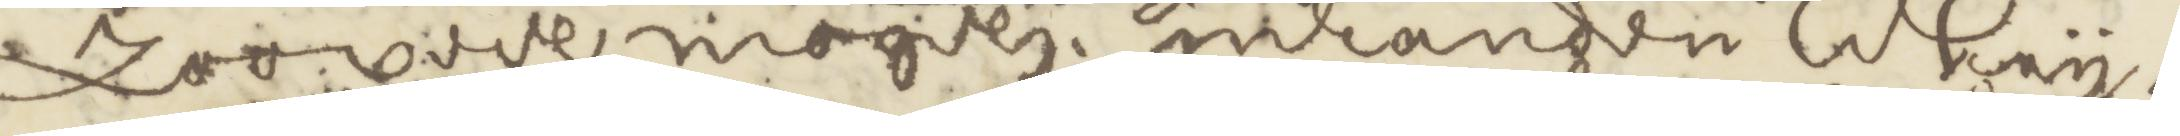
zoo veel mogelijk inhanden te krij„
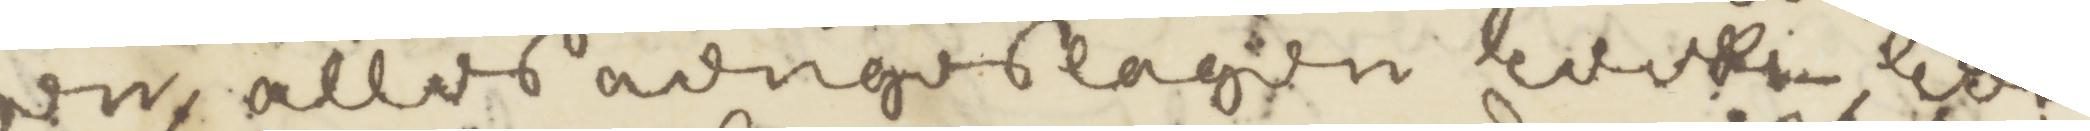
gen, alles aengeslagen heeft het
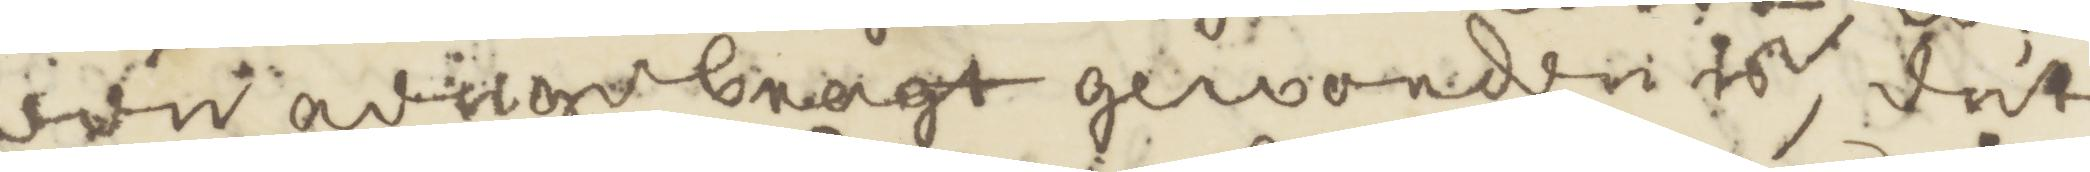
geen aengebragt geworden is, en't
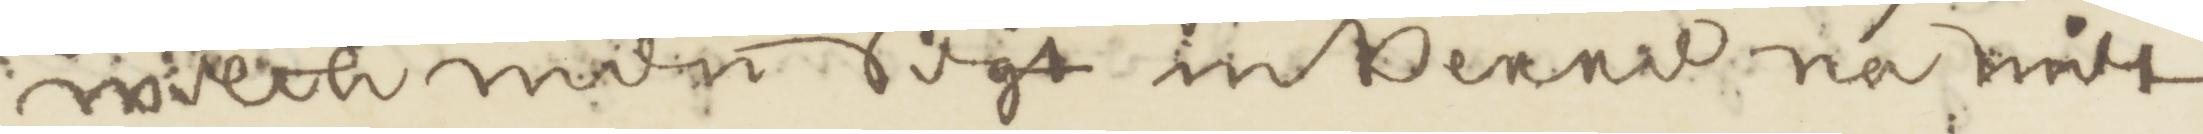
welck men segt in verre na niet
